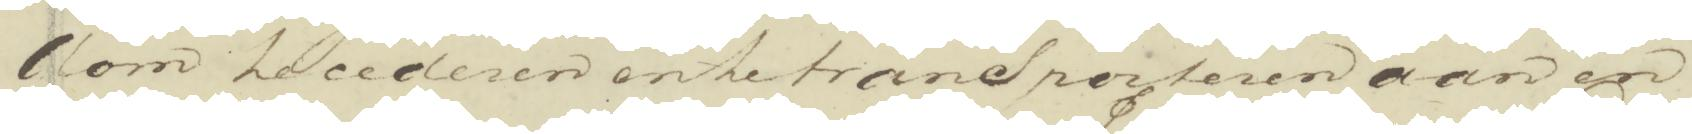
dom te cederen en te transporteren aan en
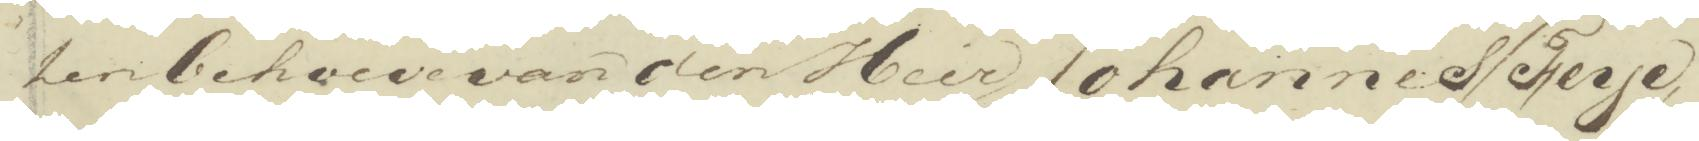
ten behoeve van den Heer Johannes Feye,
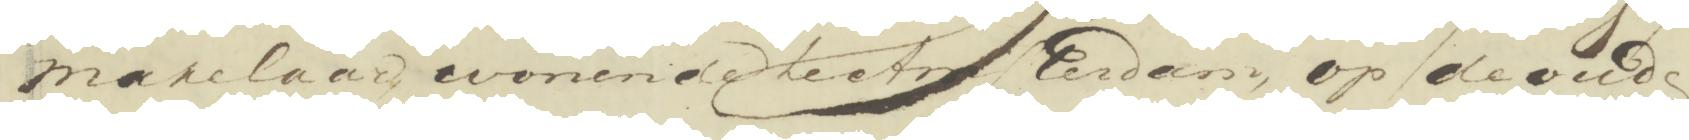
makelaar, wonende te Amsterdam, op de oude
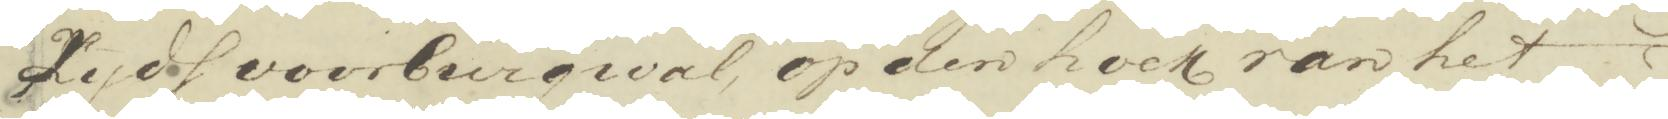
Zyds voorburgwal, op den hoek van het
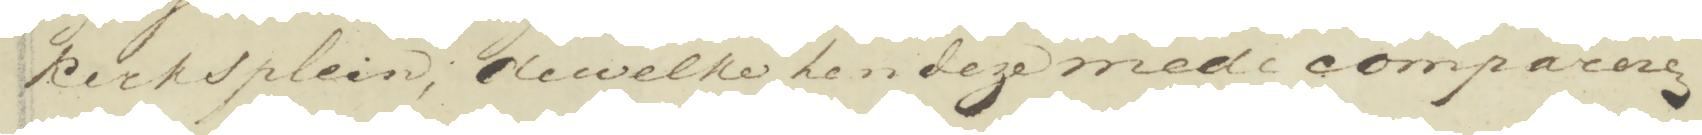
kerksplein; dewelke, ten deze mede compareren
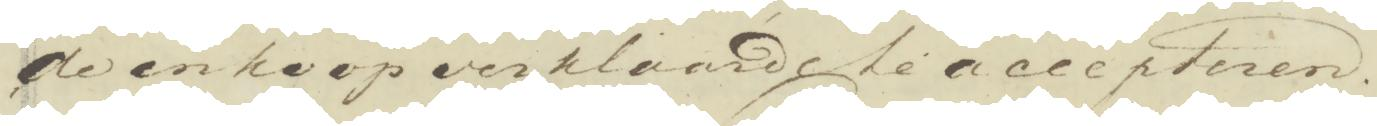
de in koop verklaarde te accepteren.
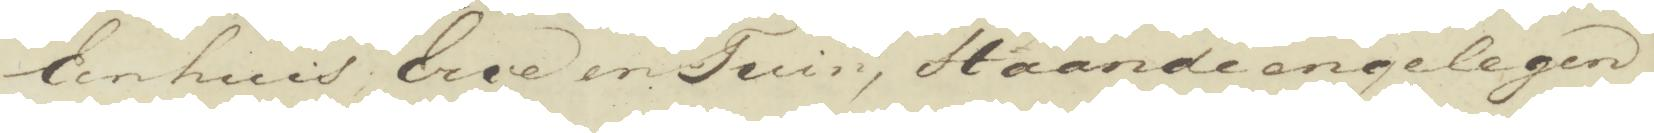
Een huis, Erve en Tuin, staande en gelegen
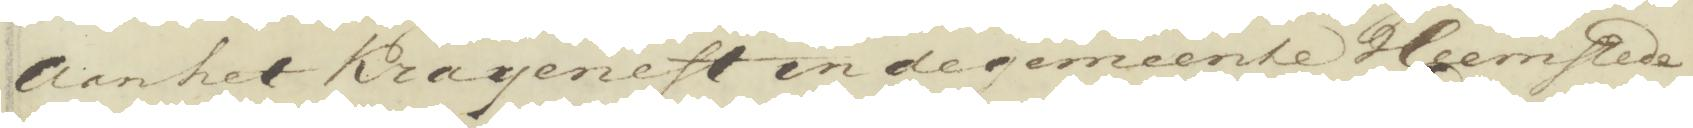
aan het Krayenest in de gemeente Heemstede
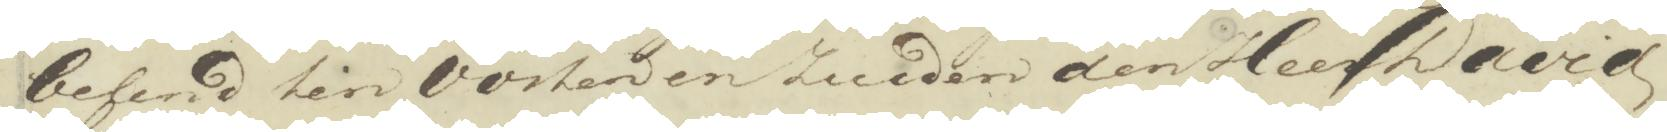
belend ten Oosten en zuiden den Heer David
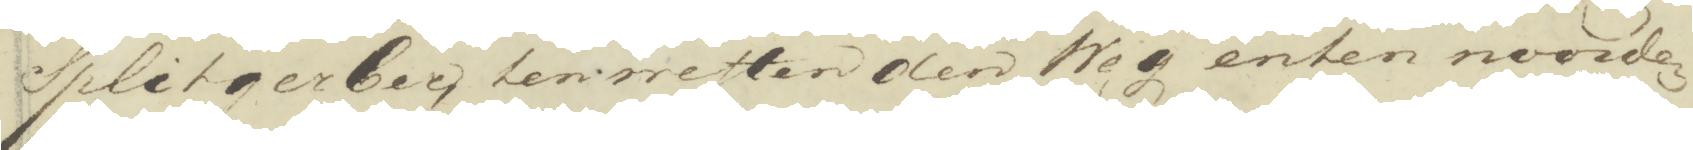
Splitgerber, ten westen den Weg enten noorden
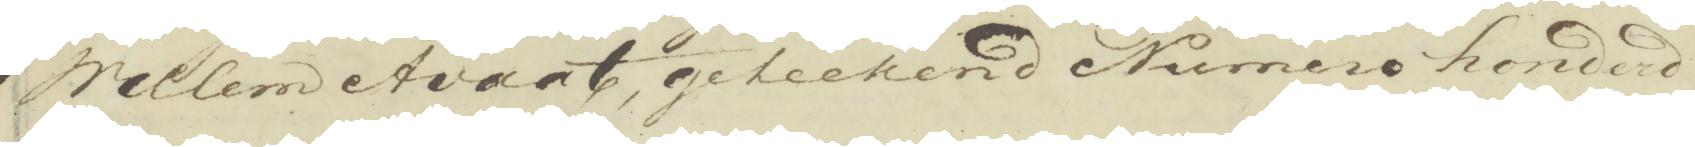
Willem Avaat, geteekend Numero honderd
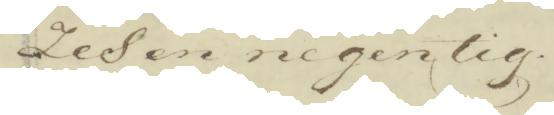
zes en negentig.
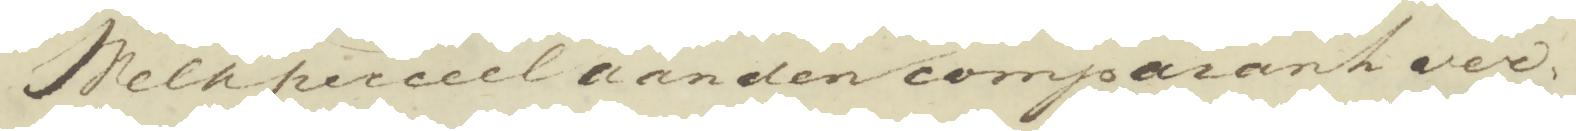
Welk perceel aan den comparant ver„
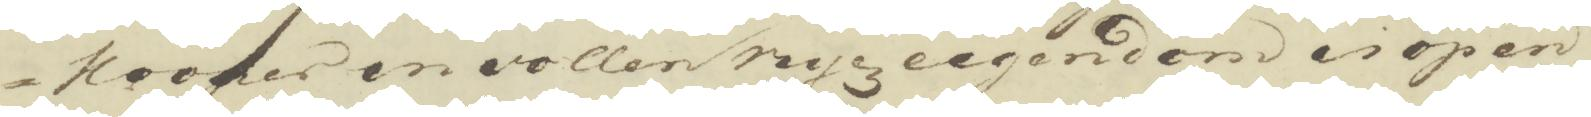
=kooper in vollen vryen eigendom is op en
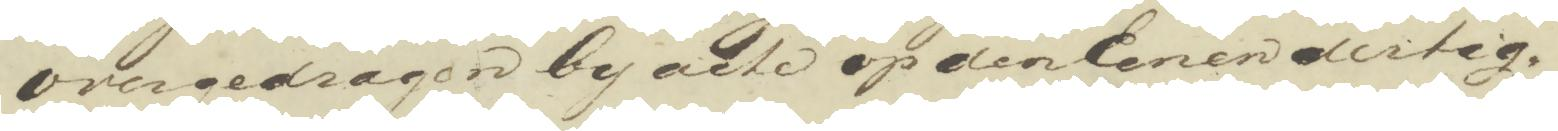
overgedragen by acte op den Eenen dertig„
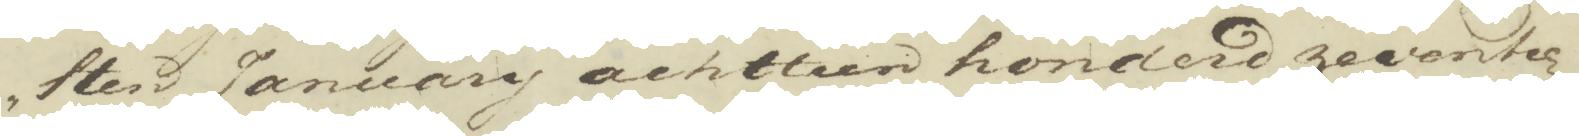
„sten January achttien honderd zeventig
